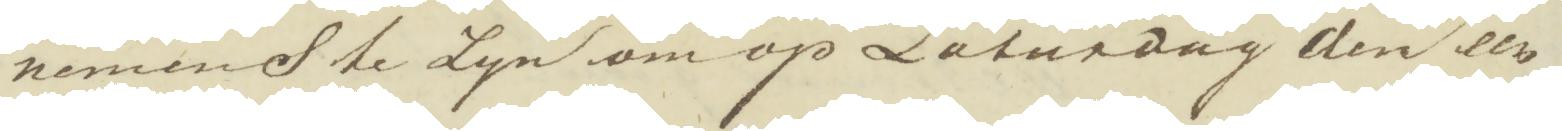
nemens te zyn om op Zaturdag den een
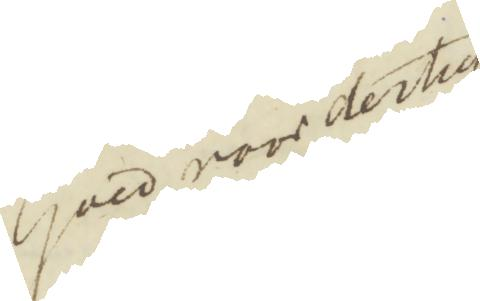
Goed voordertig
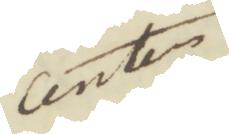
centen
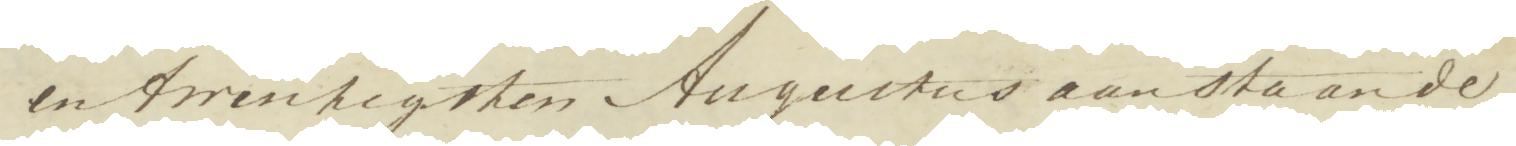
en twintigsten Augustus aanstaande
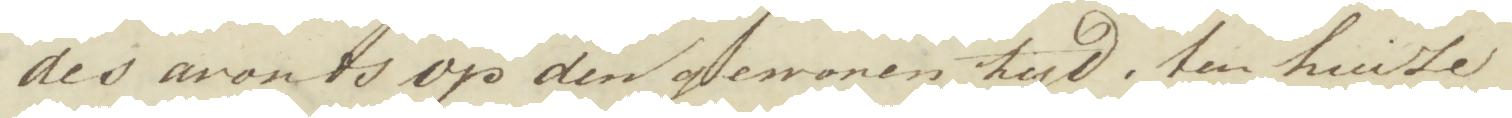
des avonds op den gewonen tyd, ten huize
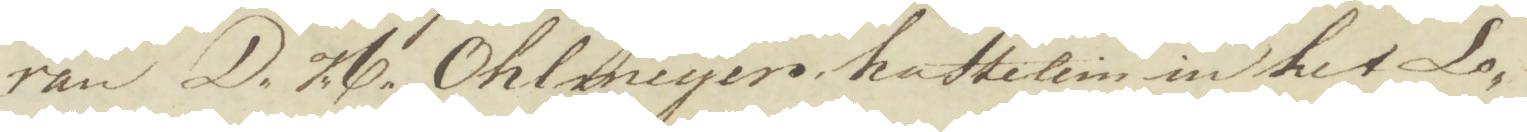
van D„ H„ Ohlmeijer, kastelein in het Lo„
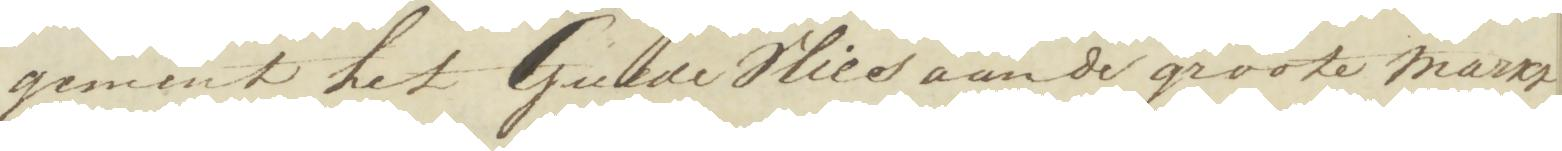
gement het Gulde Vlies aan de groote markt
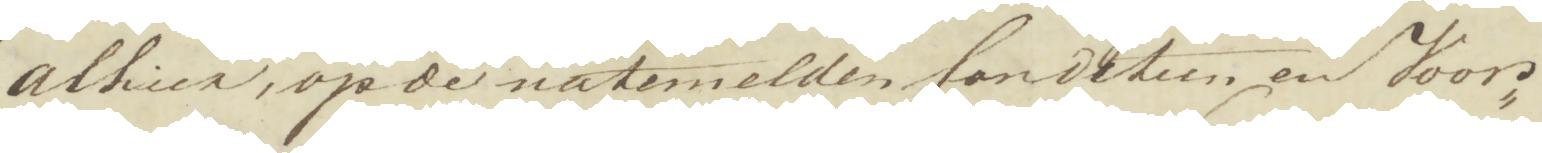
alhier, op de natemelden Conditien en Voor„
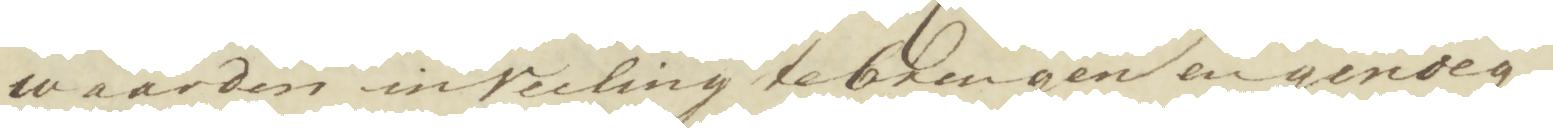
waarden in veiling te brengen en genoeg
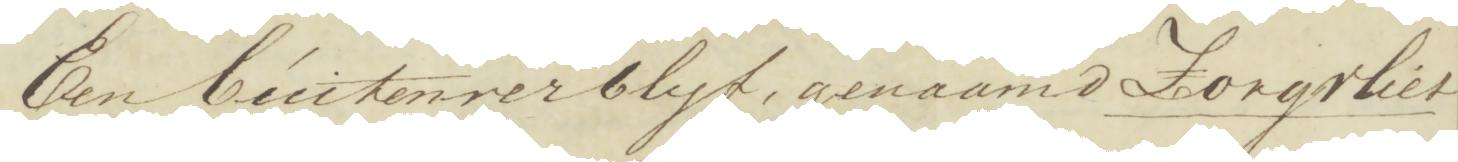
Een buitenverblyf, genaamd Zorgvliet
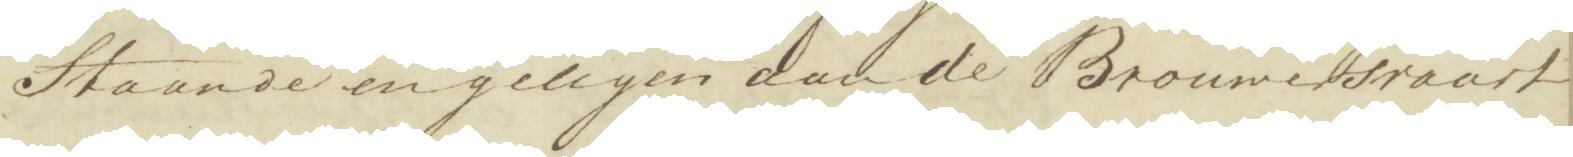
staande en gelegen aan de Brouwersvaart
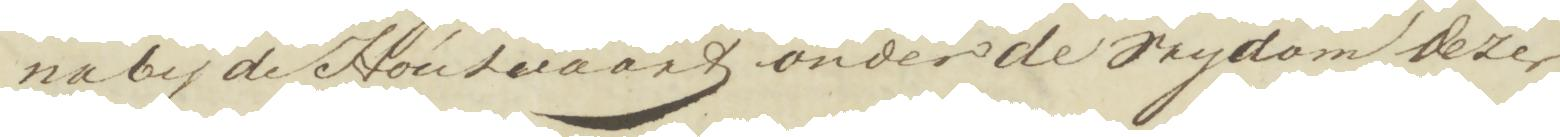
naby de Houtvaart onder de vrydom deze
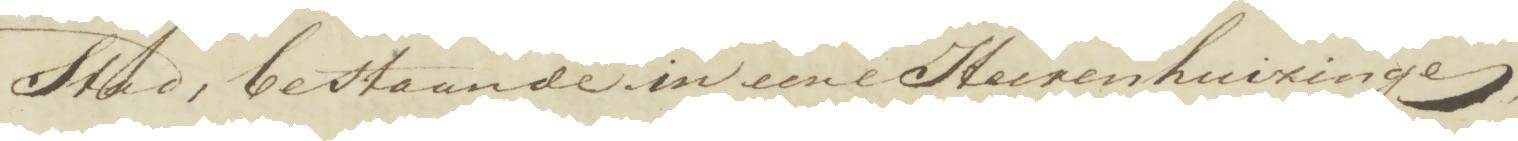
stad, bestaande in eene Heerenhuizinge,
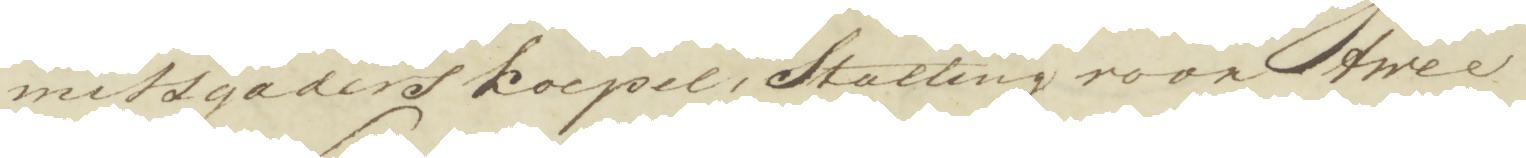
mitsgaders koepel, stalling voor twee
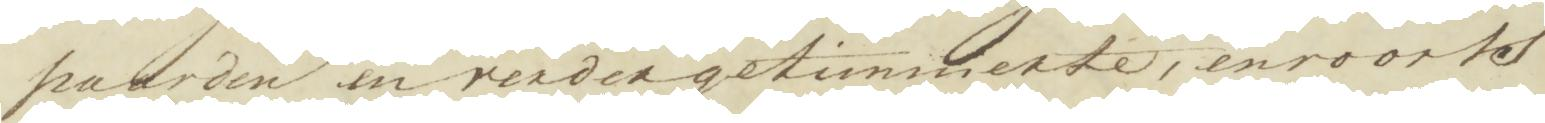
paarden en verder getimmerte, en voorts
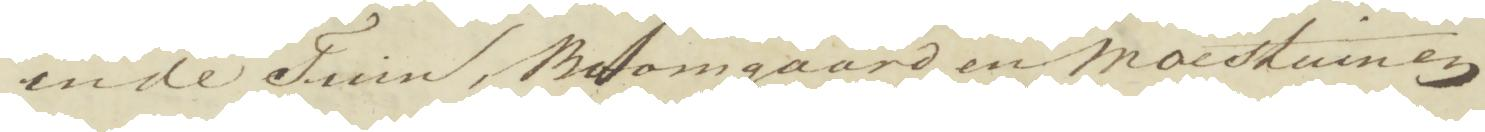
in de Tuin, Boomgaard en moestuinen
